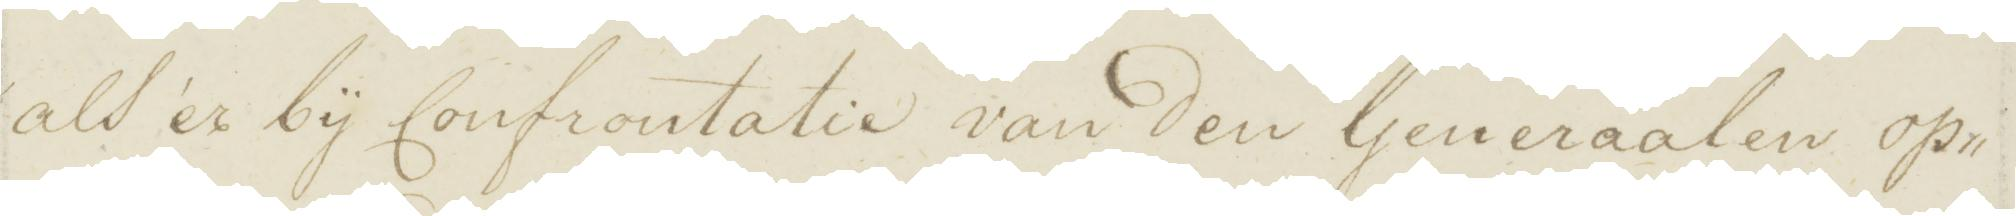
als 'er bij Confrontatie van den Generaalen op„
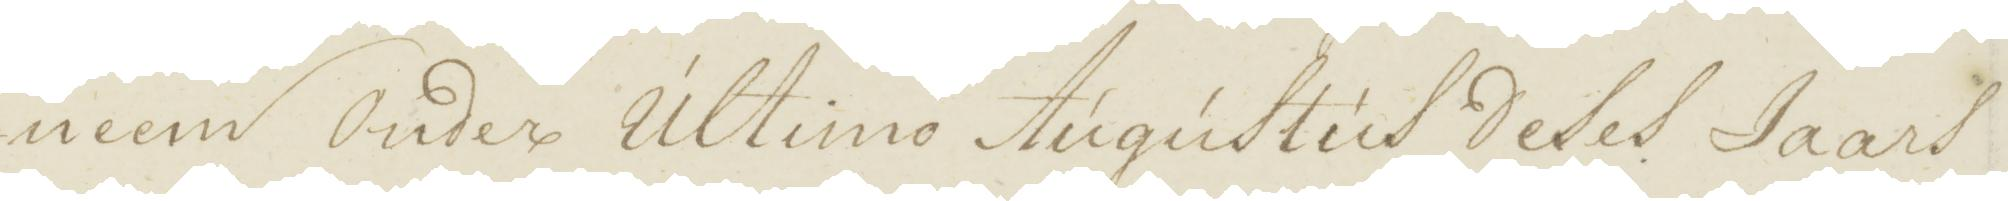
neem Onder Ultimo Augustus deses Jaars
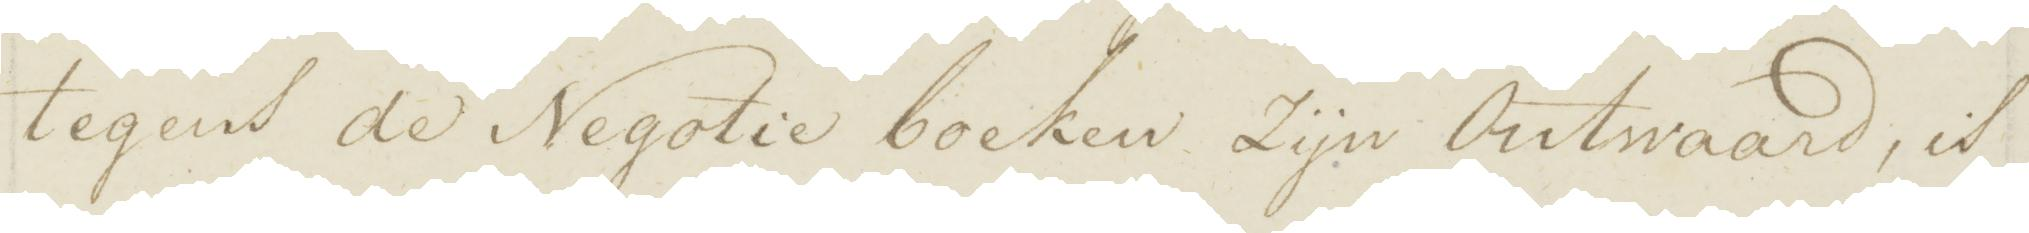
tegens de Negotie boeken zijn Ontwaard, is
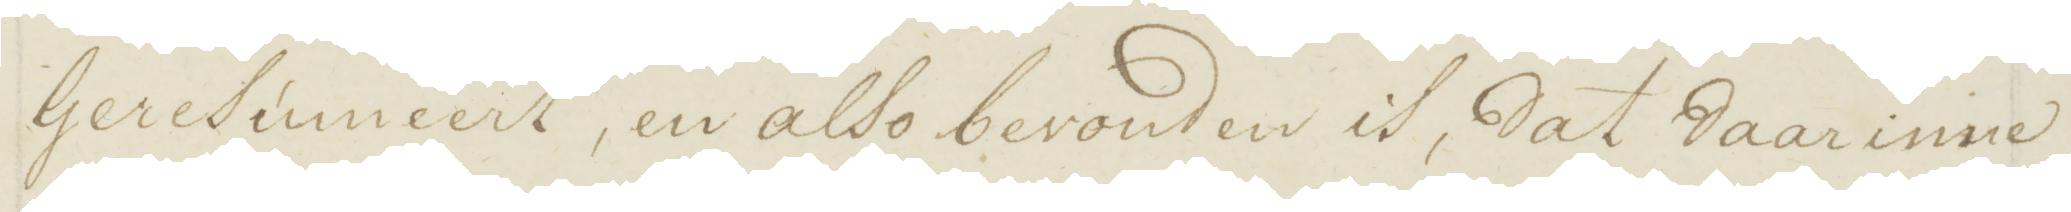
Geresumeert, en also bevonden is, dat daar inne
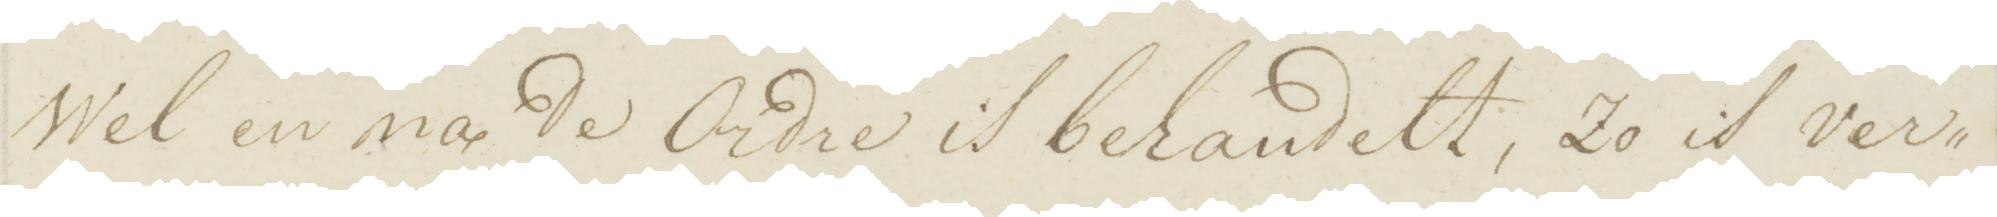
wel en na de Ordre is behandelt, zo is ver„
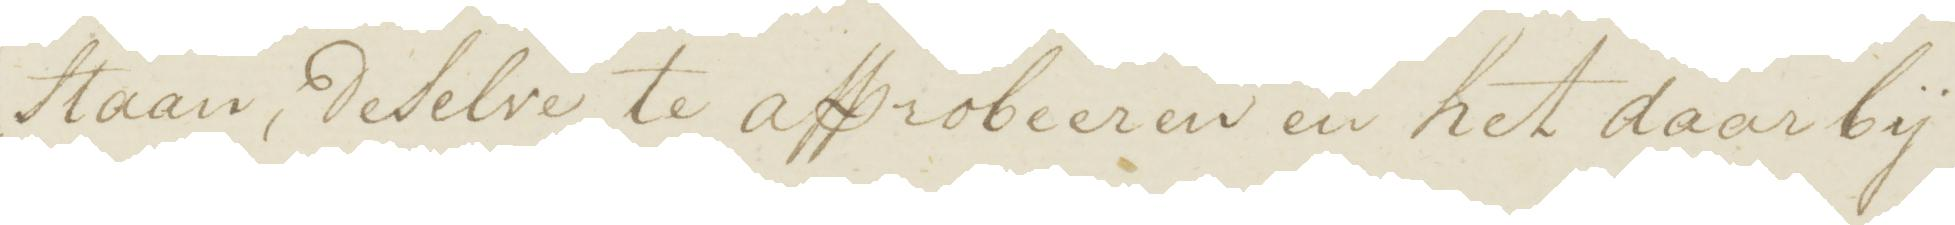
staan, deselve te approbeeren en het daar bij
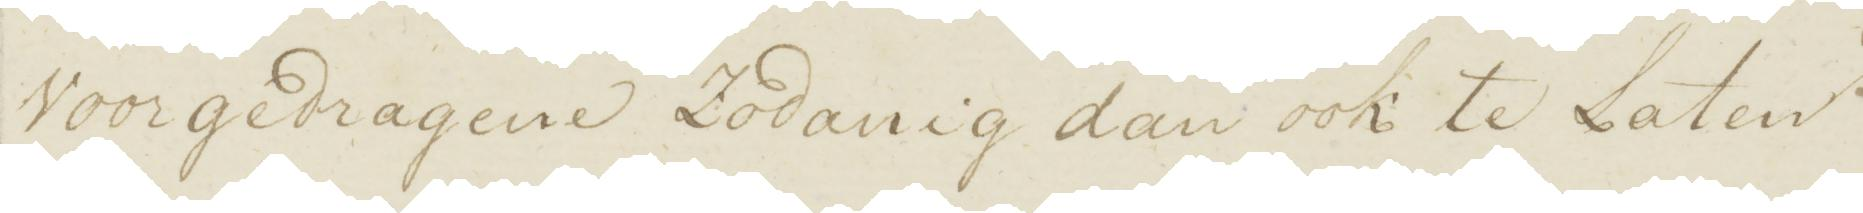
voorgedragene zodanig dan ook te laten
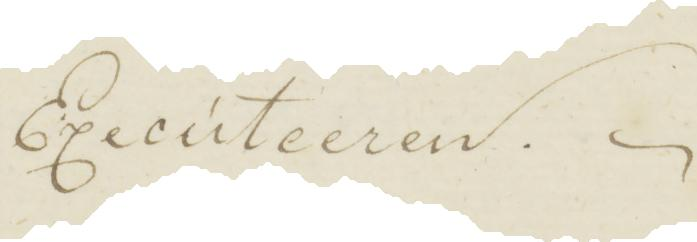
Executeeren.-
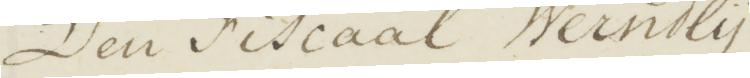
Den Fiscaal Werndlij
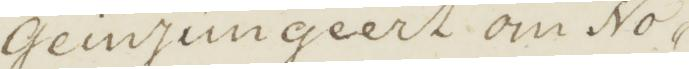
geinjungeert om No
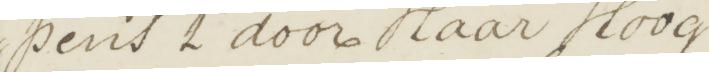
„pens 't door Haar Hoog
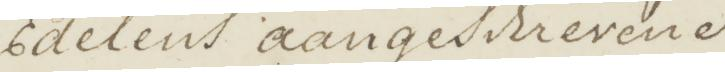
Edelens aangeschrevene
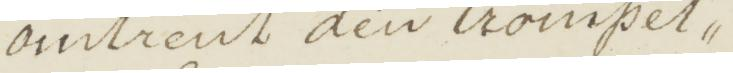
omtrent den trompet„
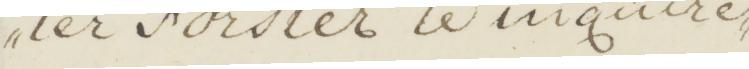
„ter Forster te inquire
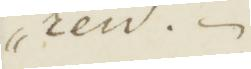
ren.-
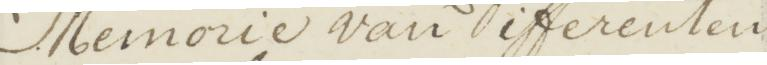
Memorie van differenten
